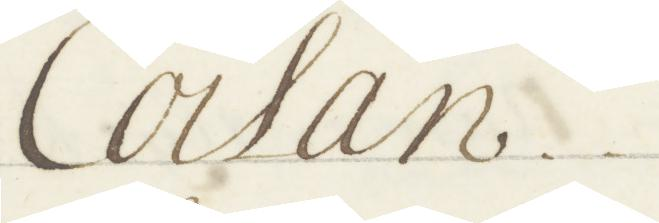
Coilan. .
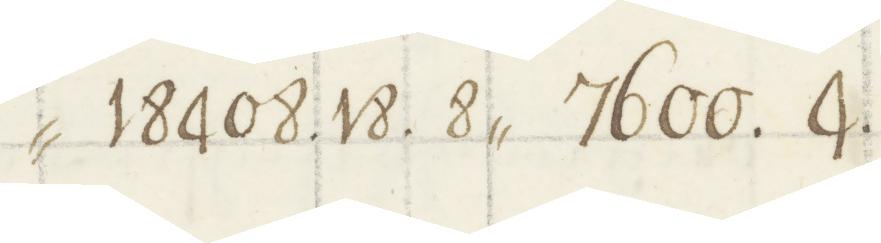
„ 18408.18.8„ 7600.4.
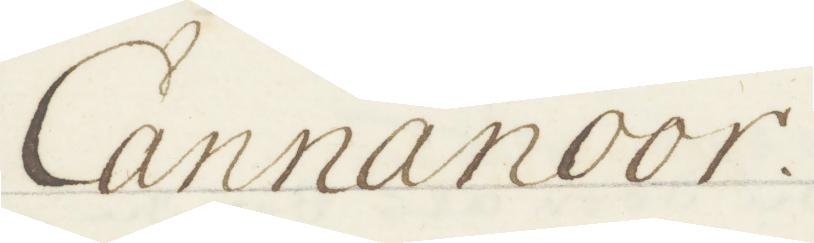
Cannanoor.
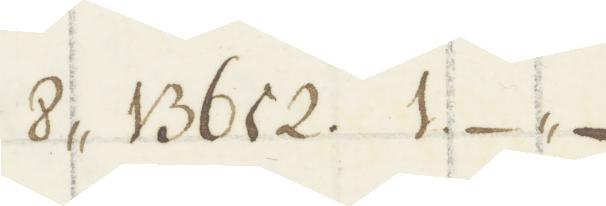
8„ 13652.1.—„—
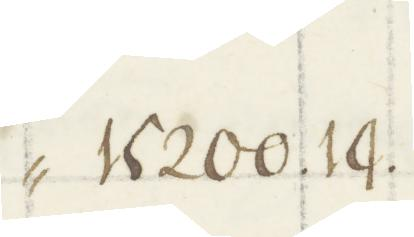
„ 15200.14.
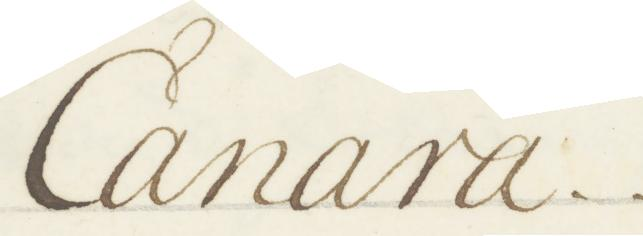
Canara.
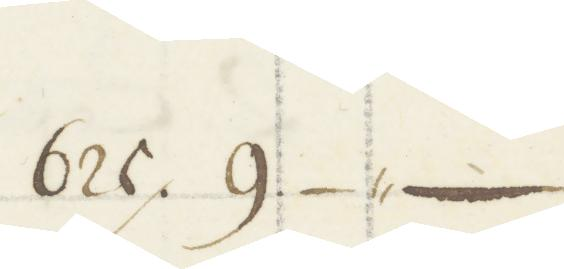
625.9.—„—
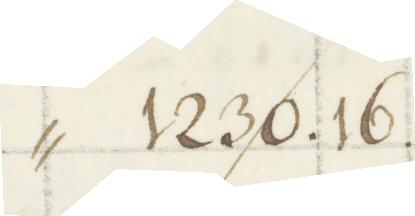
„ 1230:16.
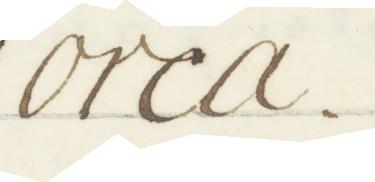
Porca.
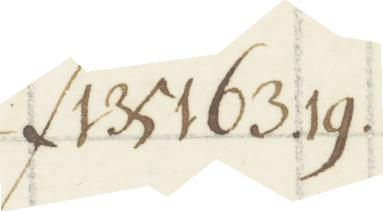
ƒ135163.19.
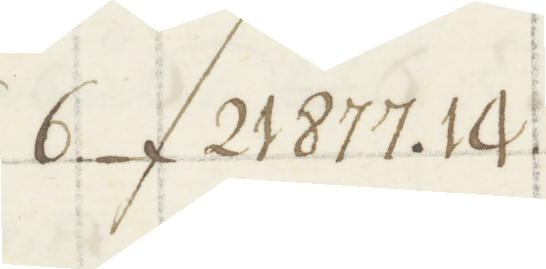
6. ƒ 21877.14
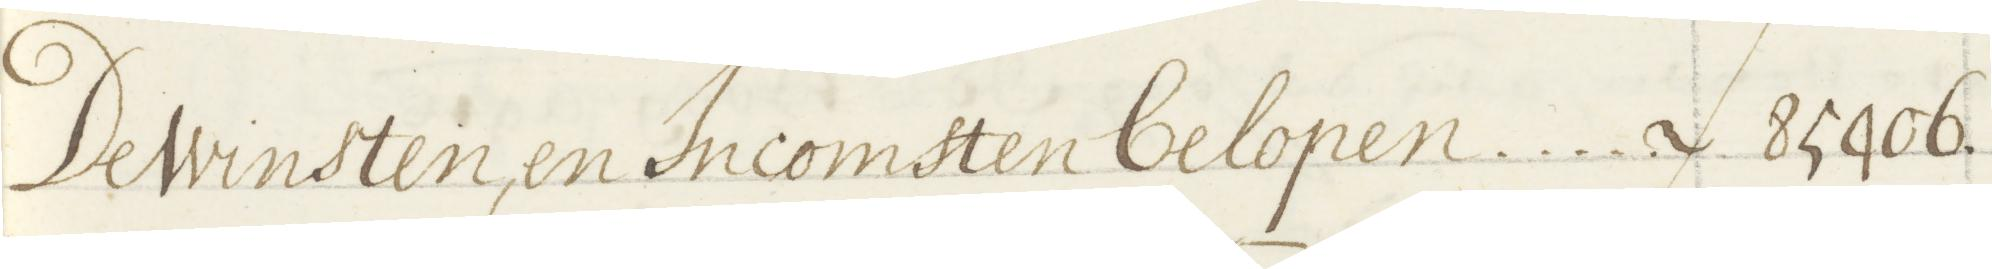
De winsten, en Incomsten belopen . . . . . . ƒ 85406.
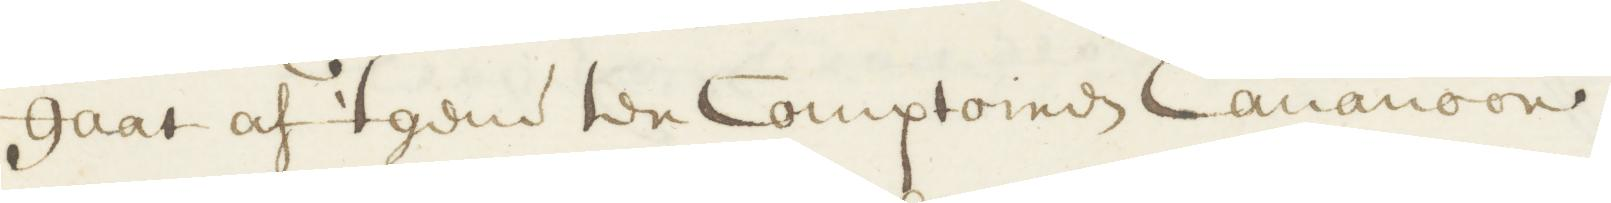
gaat af ’t gene ter Comptoiren Cananoor
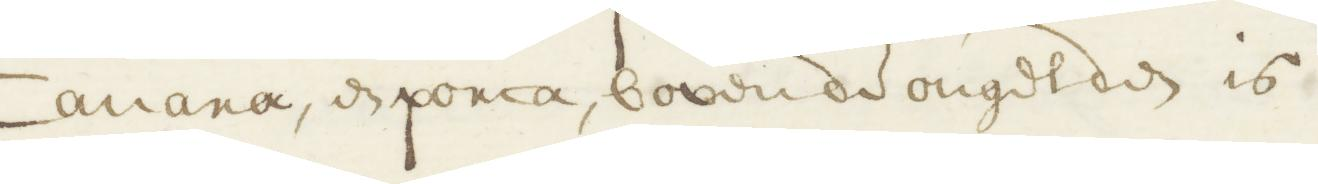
Canara, en porca, boven de ongelden is
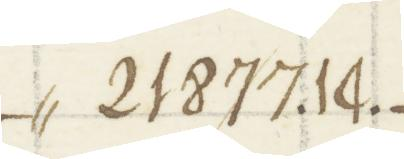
-„ 21877.14.
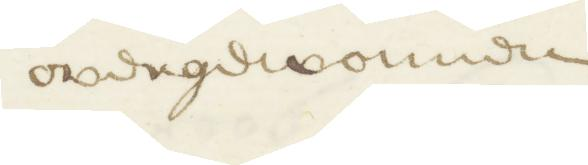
overgewonnen
